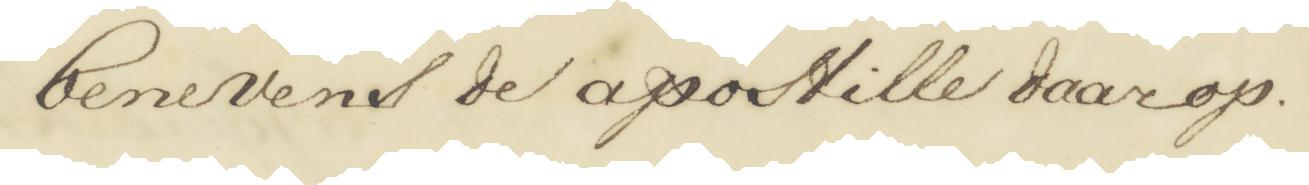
benevens de apostille daarop.
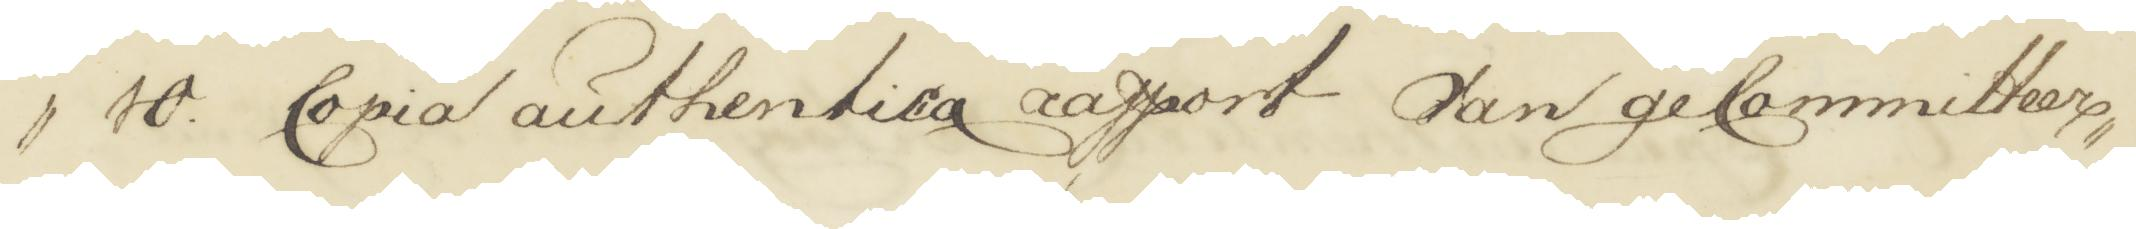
„ 10. Copia authenticq rapport van gecommitteer„
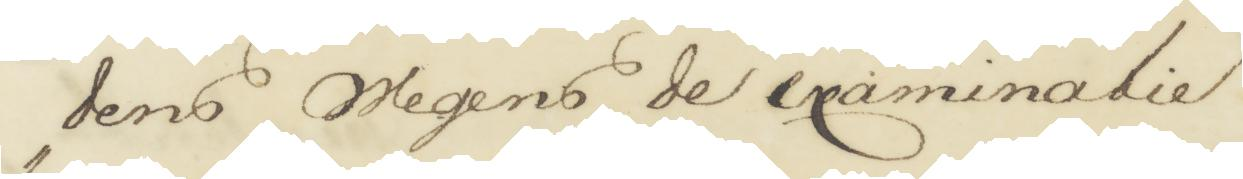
„dens wegens de examinatie
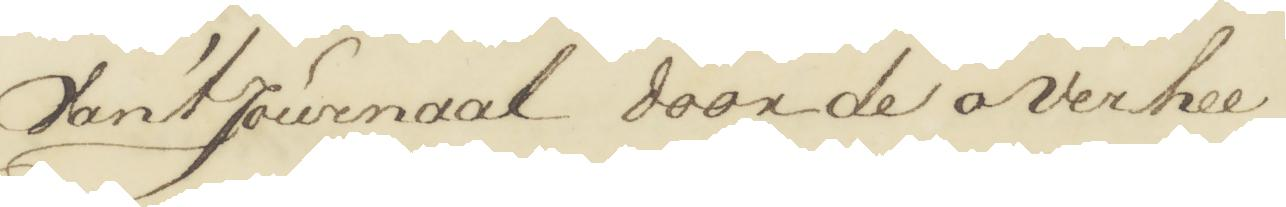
van’t Journaal door de overhee
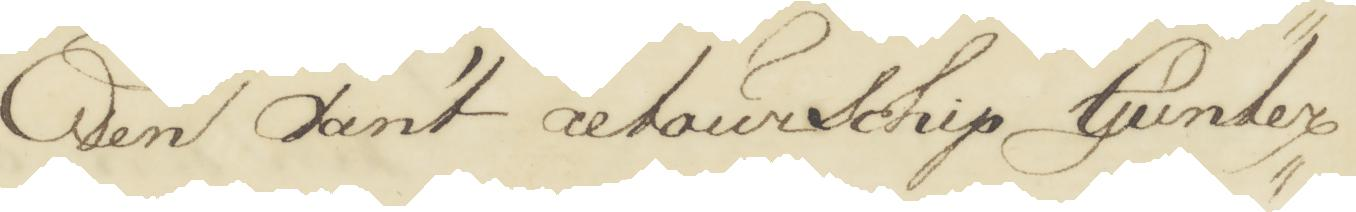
den van 't retourschip Gunter„
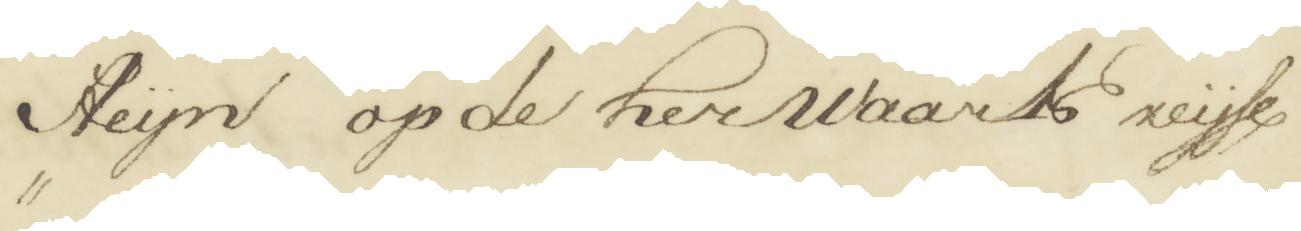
„steijn op de herwaarts reijse
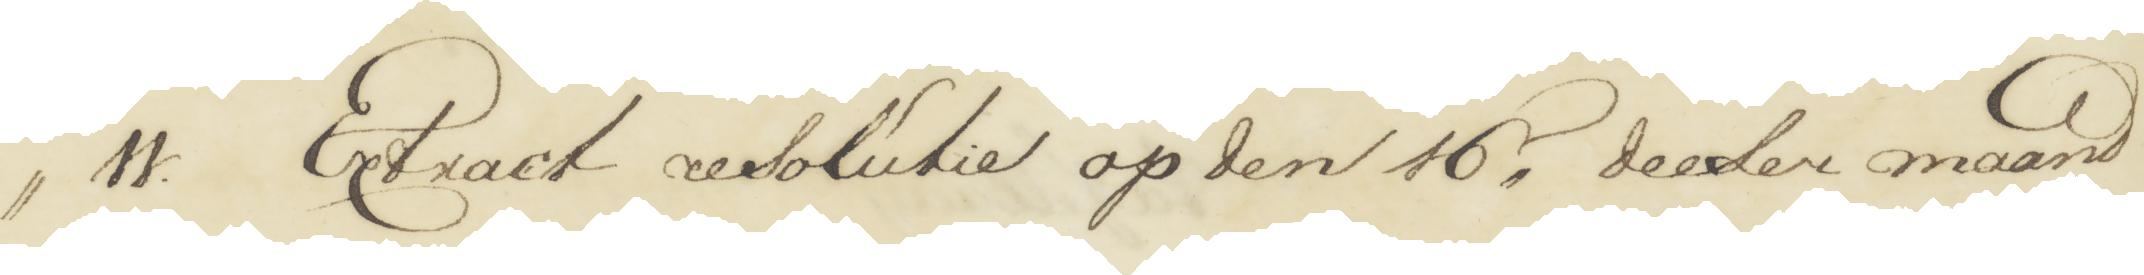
„ 11. Extract resolutie op den 16„' deeser maand
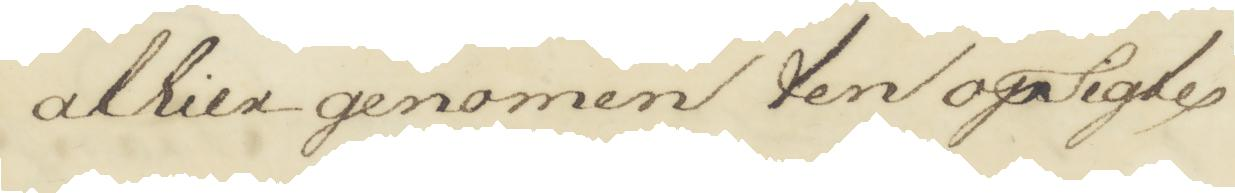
alhier genomen ten opsigte
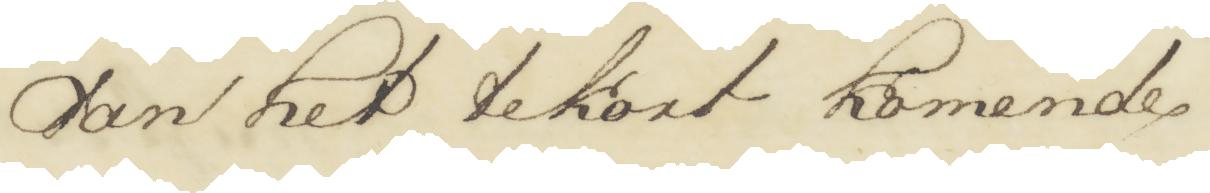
van het tekort komende
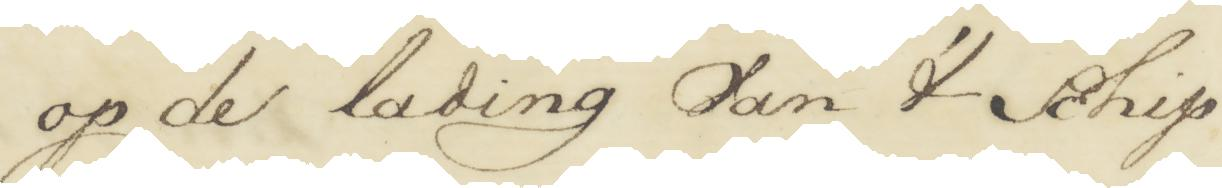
op de lading van ’t schip
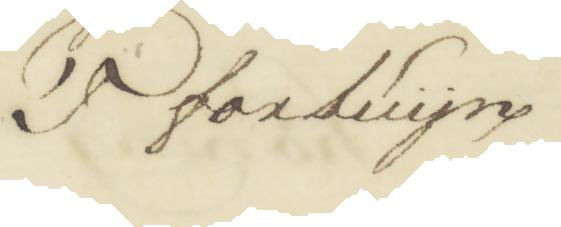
"T fortuijn
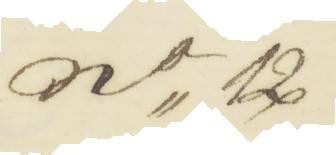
n„o 12
